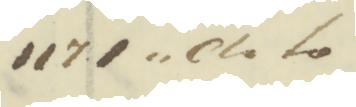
117. 1 „ dito
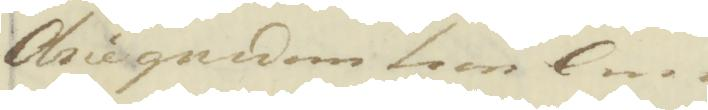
Drie guldens tien Cent
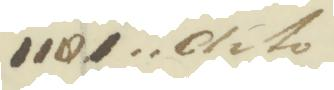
118. 1 „ dito
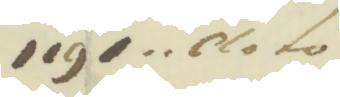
119 1 „ dito
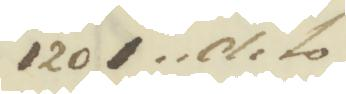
120 1 „ dito
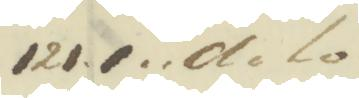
121. 1 „ dito
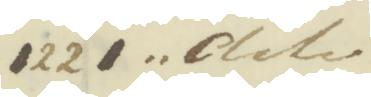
122 1 „ dito
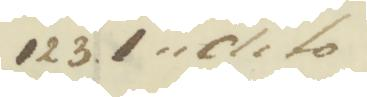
123. 1 „ dito
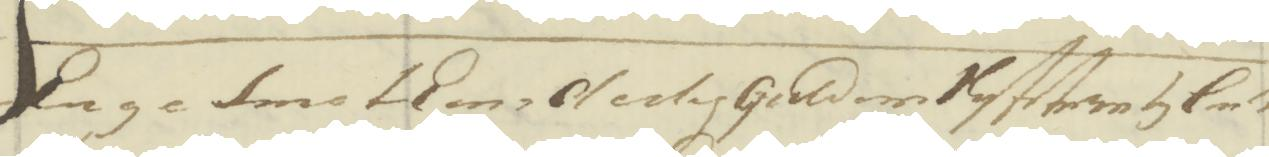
Engesmit Een en dertig Guldens Vyf en twintig Cent „
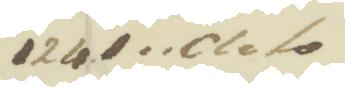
124. 1 „ dito
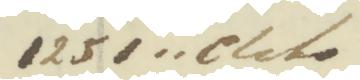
125 1 „ dito
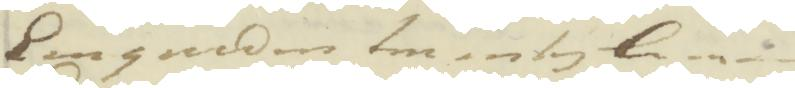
Een gulden twintig Cent —
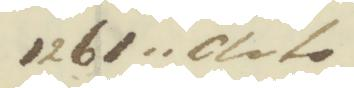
126 1 „ dito
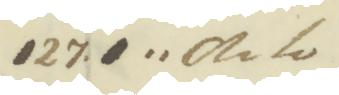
127. 1 „ dito
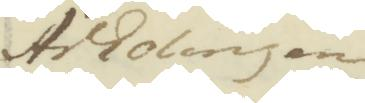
A v Holingen
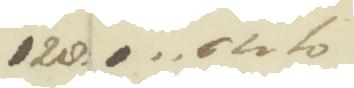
128. 1 „ dito
